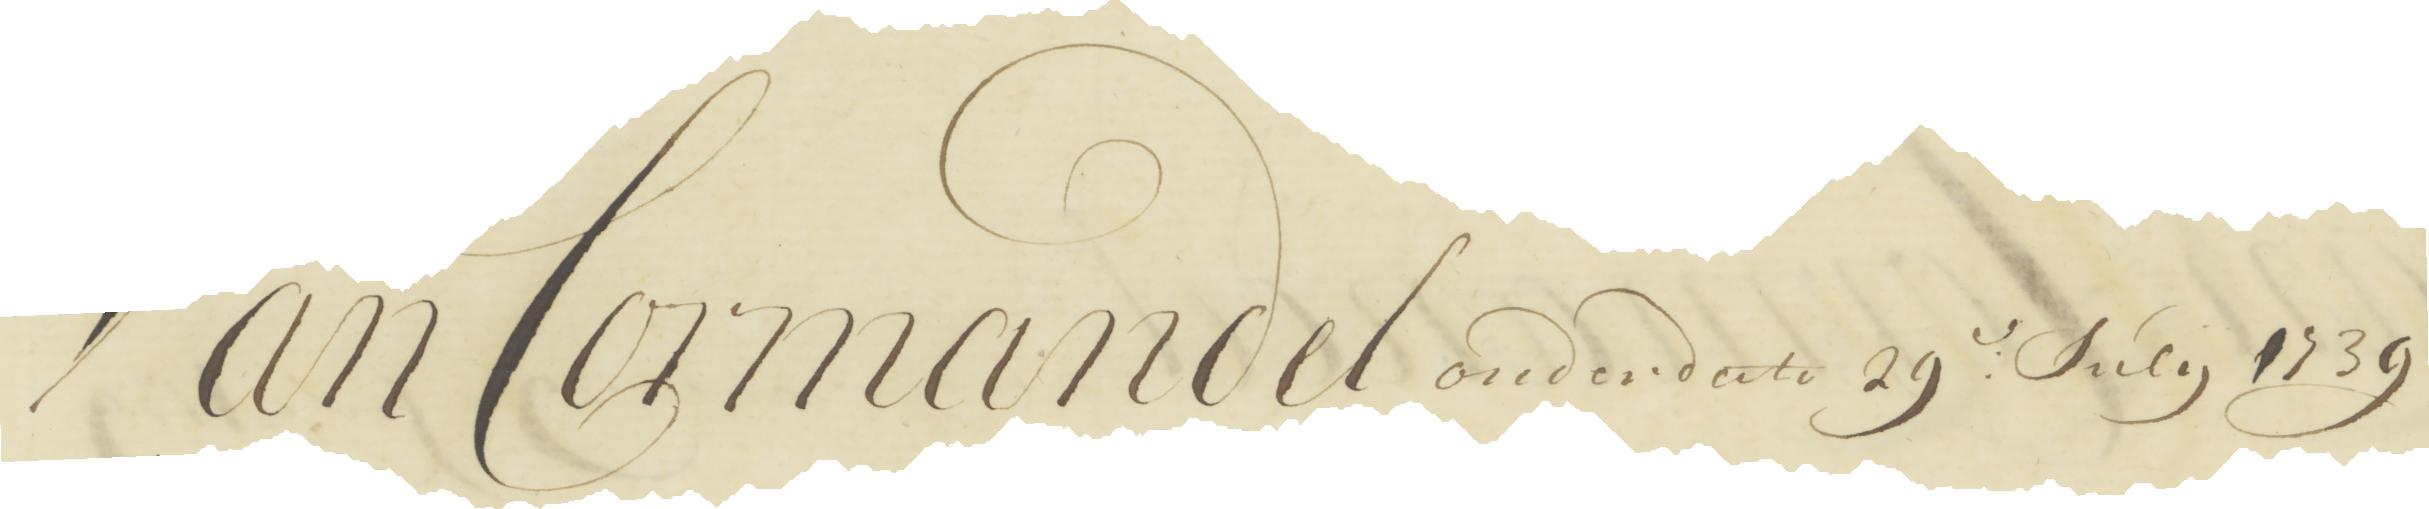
Van Cormandel onder dato 29' Iulij 1739
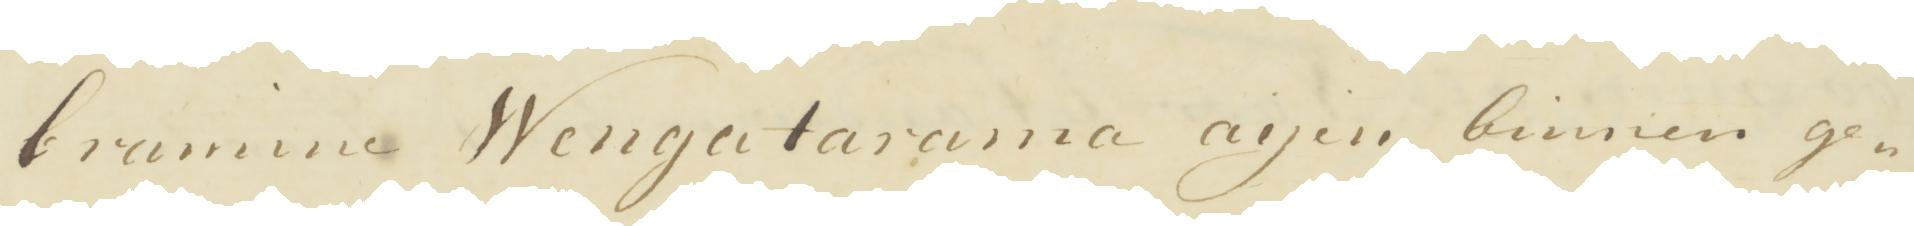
bramine Wengatarama aijen binnen ge„
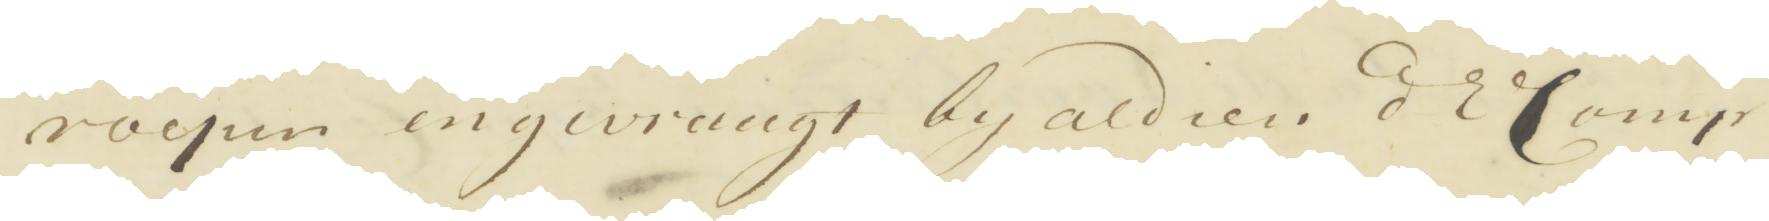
roepen en gevraagt by aldien d E Comp:s
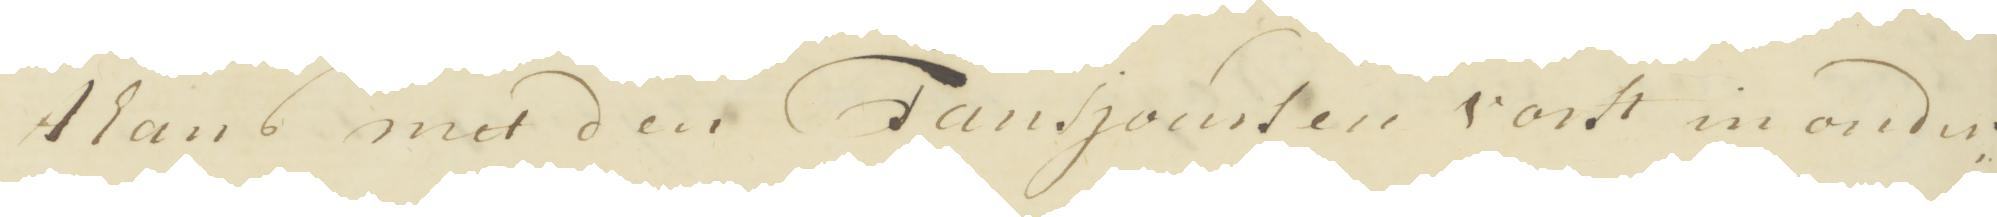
thans met den Tansjoursen vorst in onder„
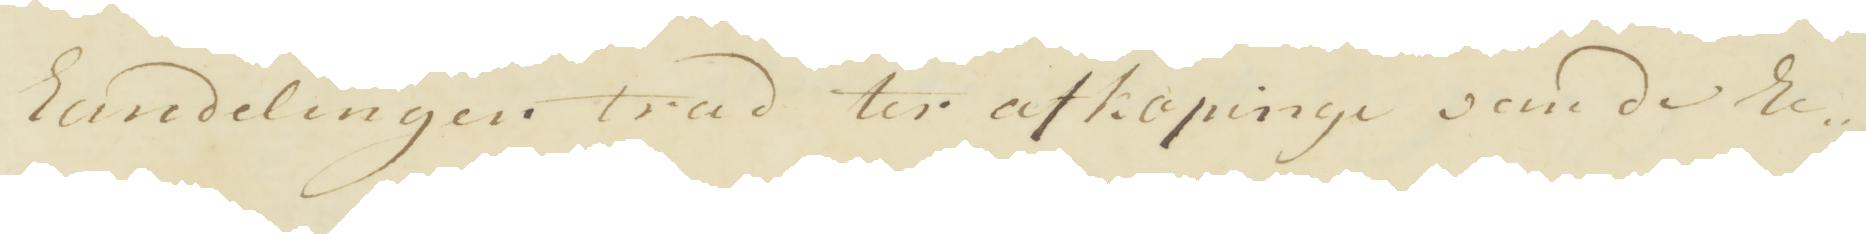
handelingen trad ter afkopinge van de re„
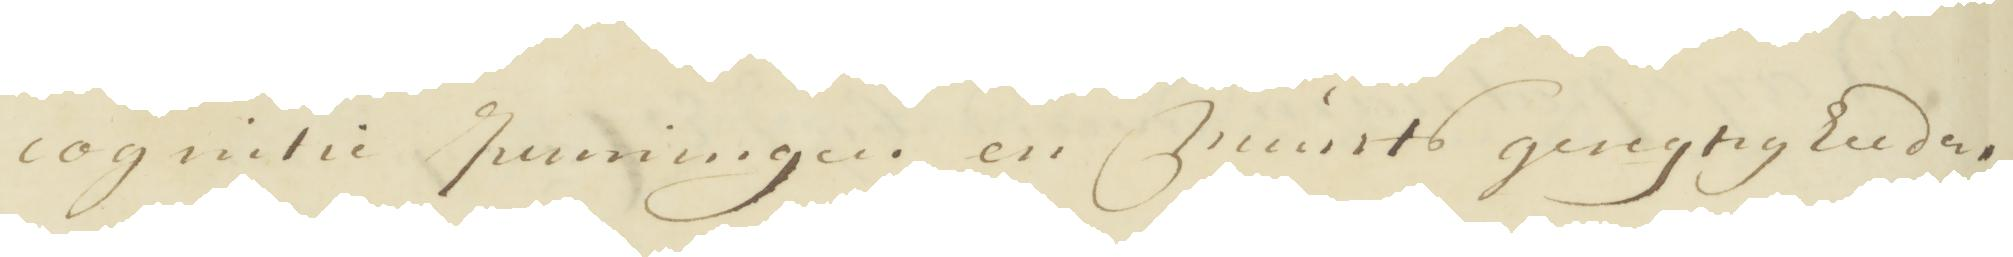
cognitie penningen en munts geregtigheeden
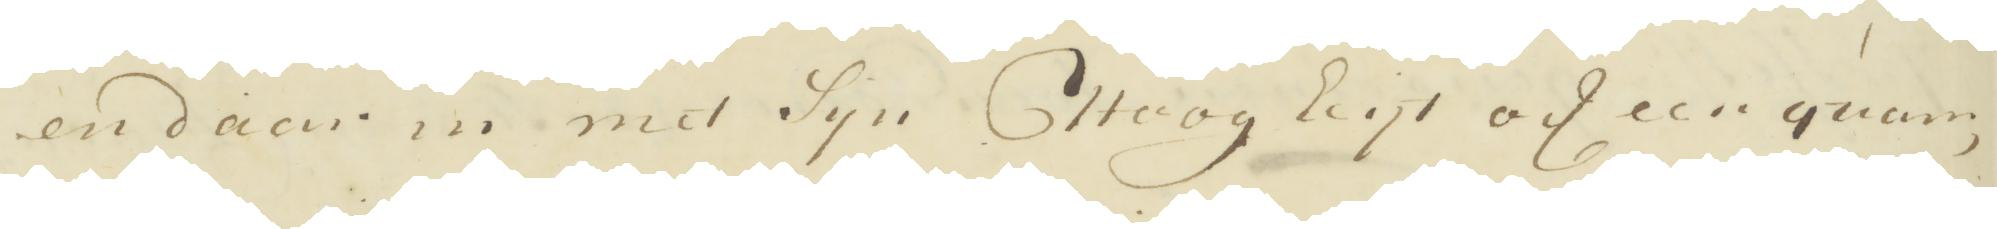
en daar in met Sijn Hoog heijt over een quam,
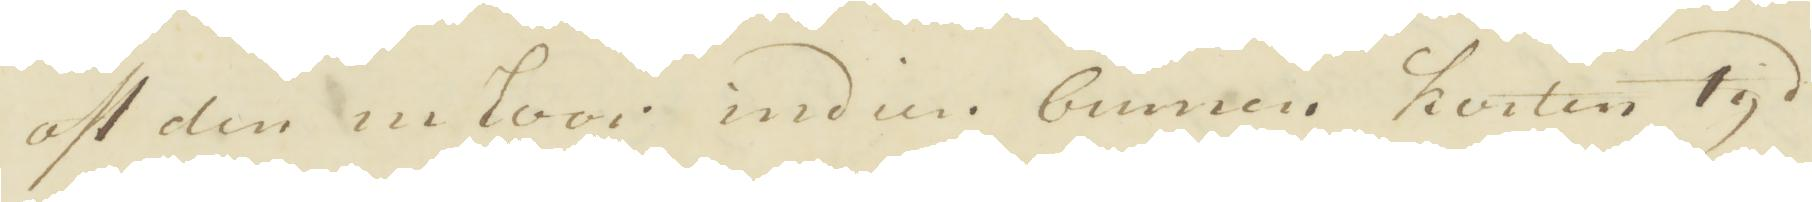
off den inhoor indien binnen korten tijd
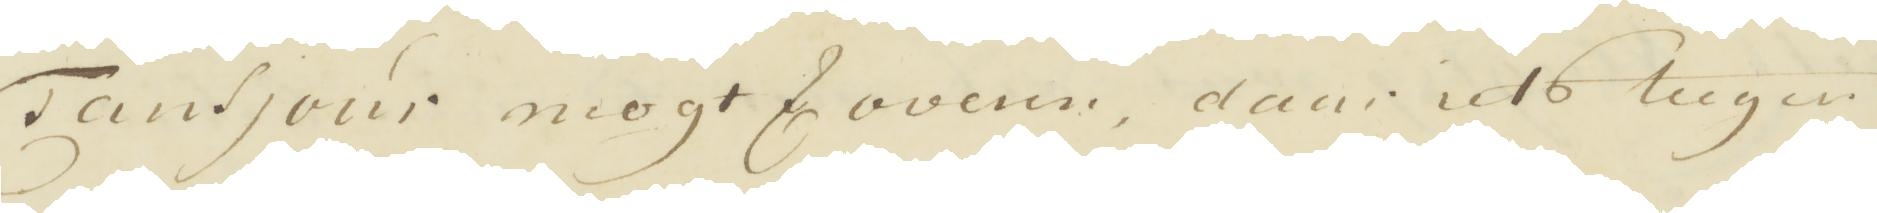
Tansjour mogt veroveren, daar iets teegen
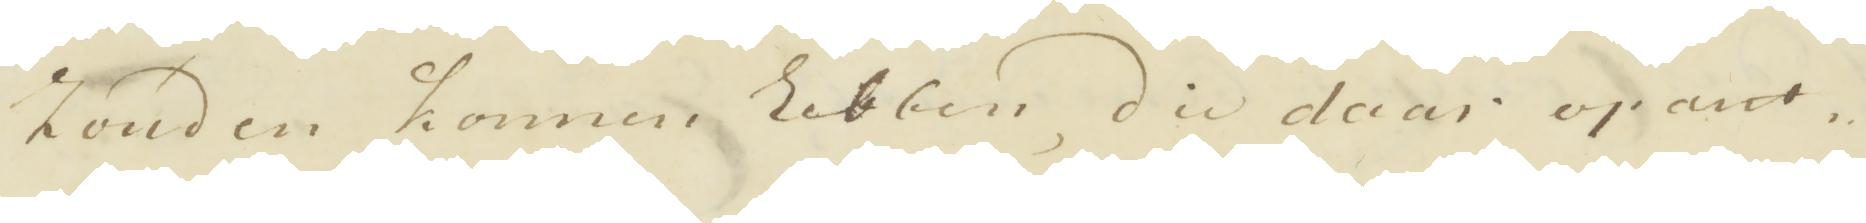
Zouden konnen hebben, die daar op ant„
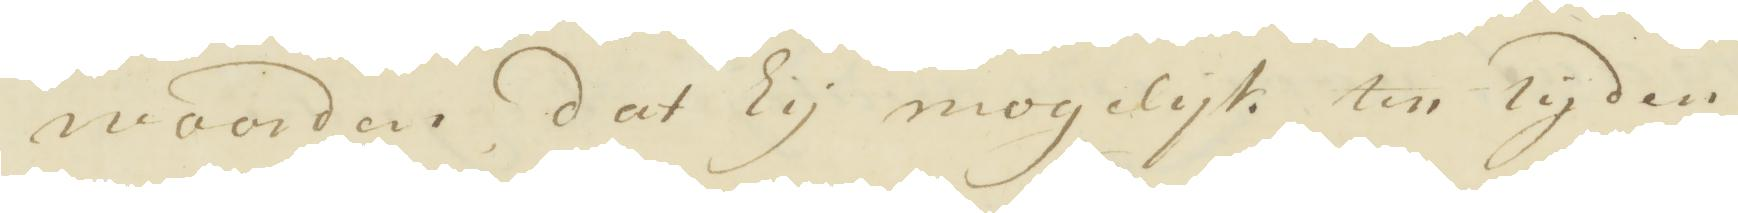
woorden dat hij mogelijk ten tijden
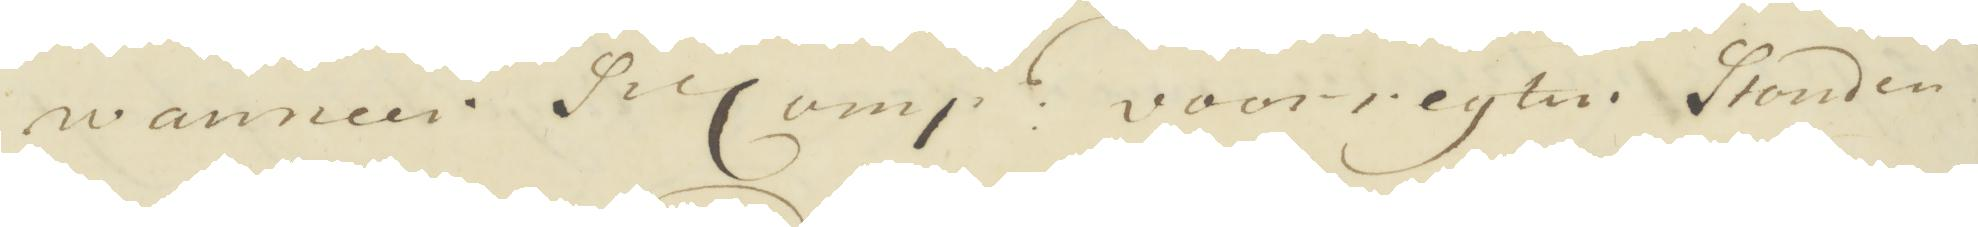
wanneer S' Comp:s voorregten Stonden
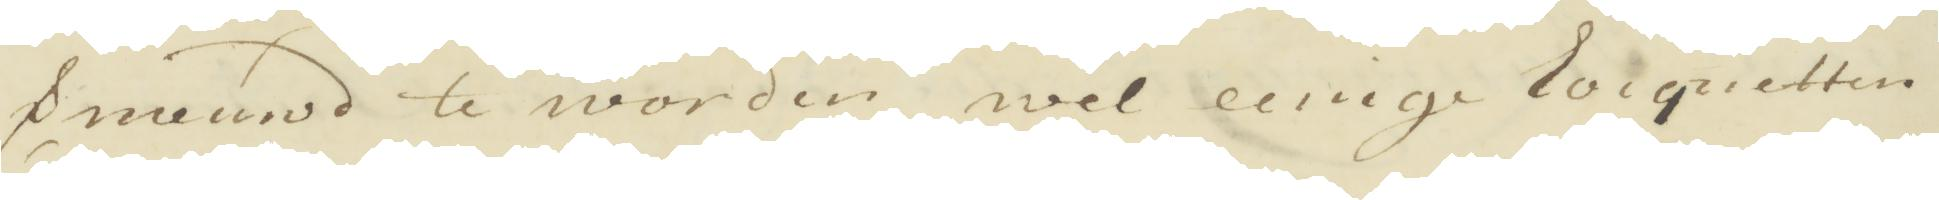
vernieuwd te worden, wel eenige hoiquetten
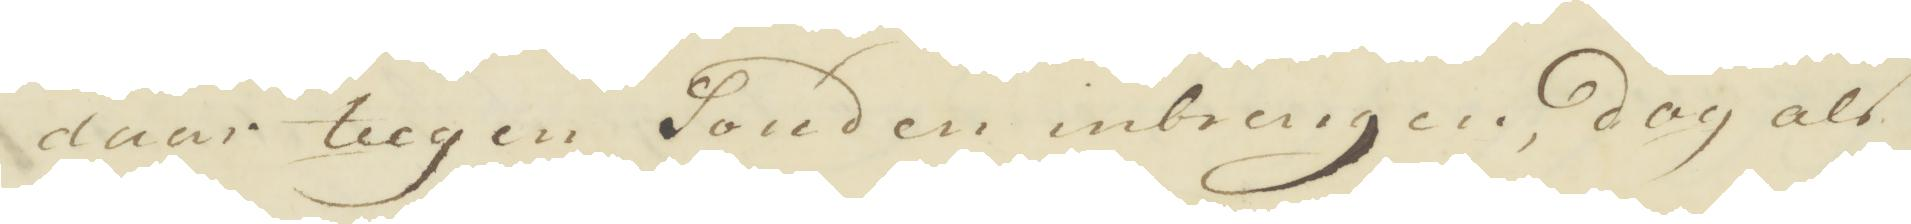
daar teegen Souden inbrengen, dog als
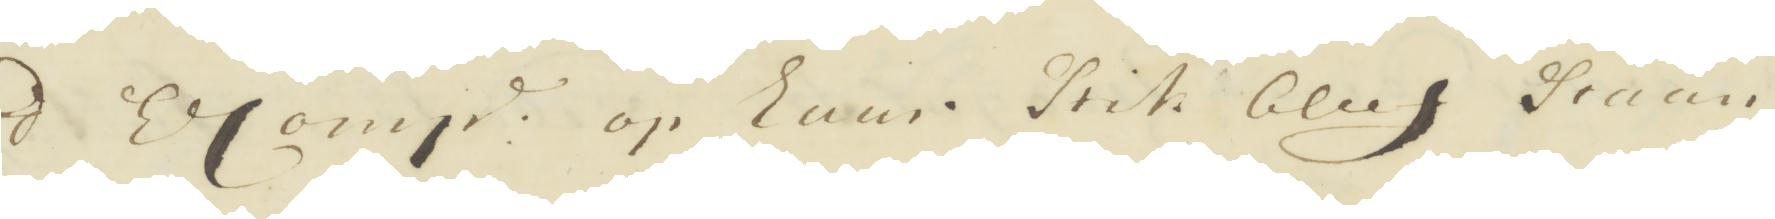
d E'Comp:e op haar Stik bleef Staan,
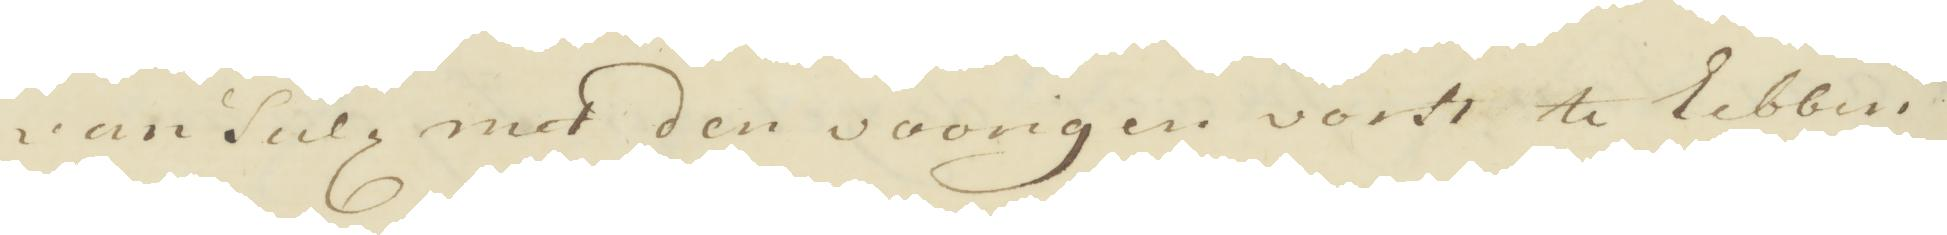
van Sulx met den voorigen vorst te hebben
